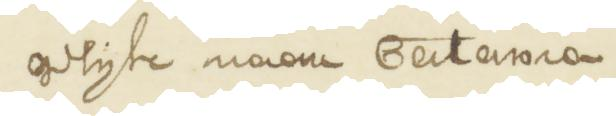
gelijk naam batavia
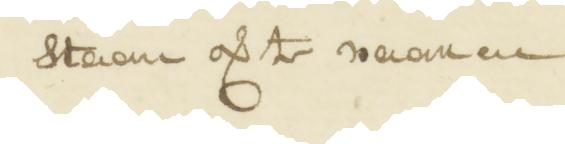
staan over te vaaren
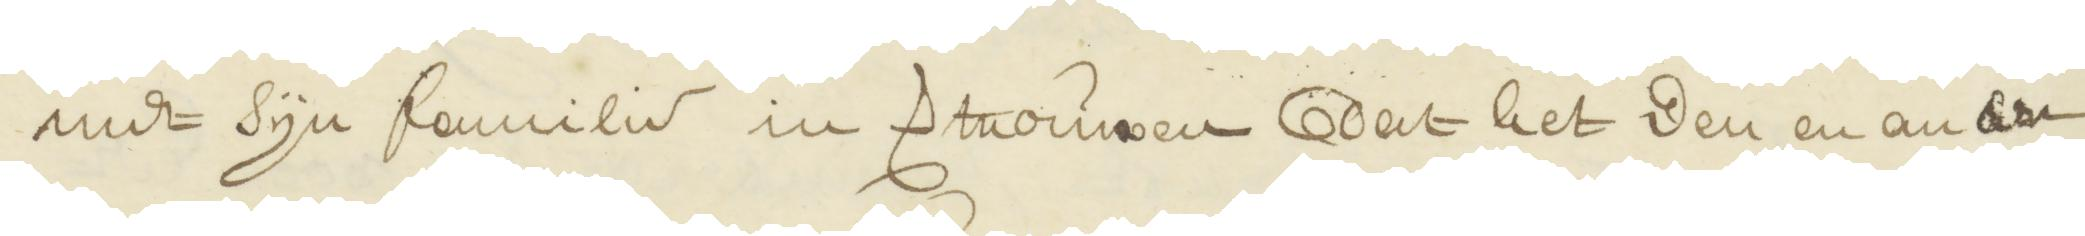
met sijn familie in vertrouwen dat het Een en ander
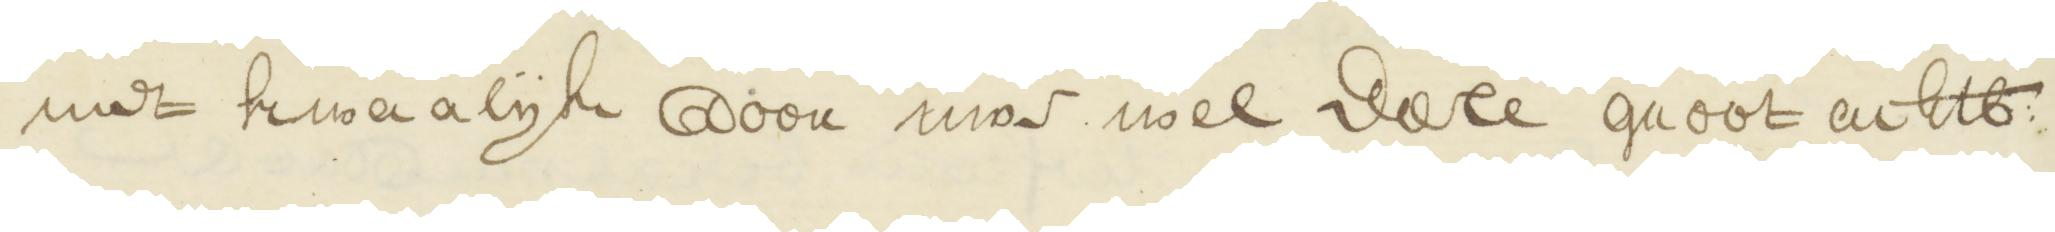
niet kwaalijk door uwe wel Edle groot achtb:
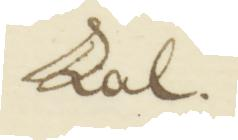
zal.
